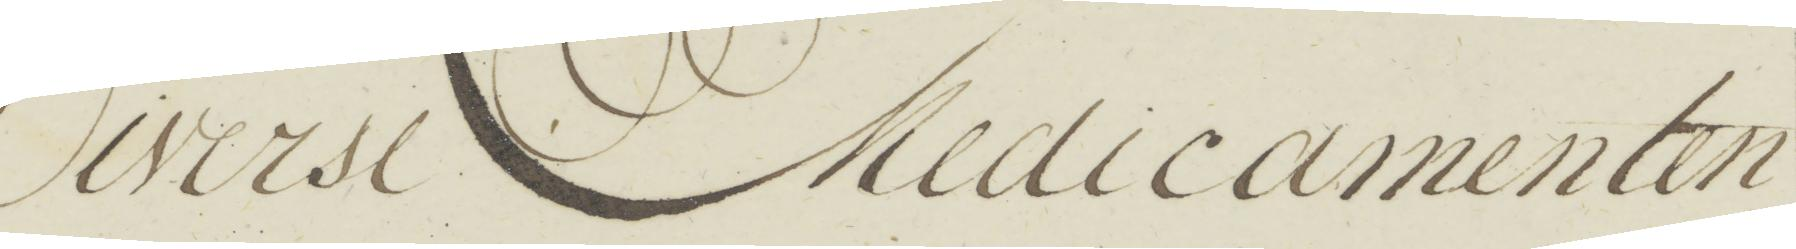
Diverse Medicamenten
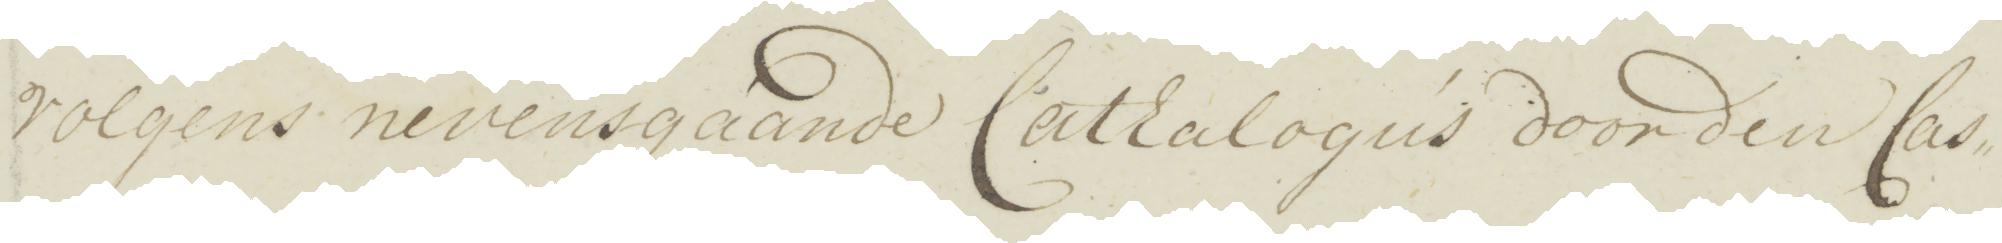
volgens nevensgaande Cathalogus door den Cas„
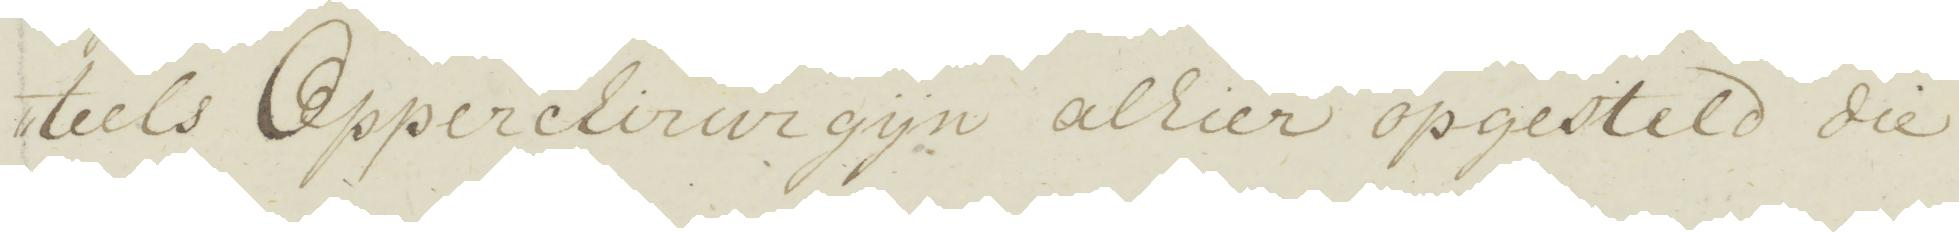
„teels Opperchirurgijn alhier opgesteld die
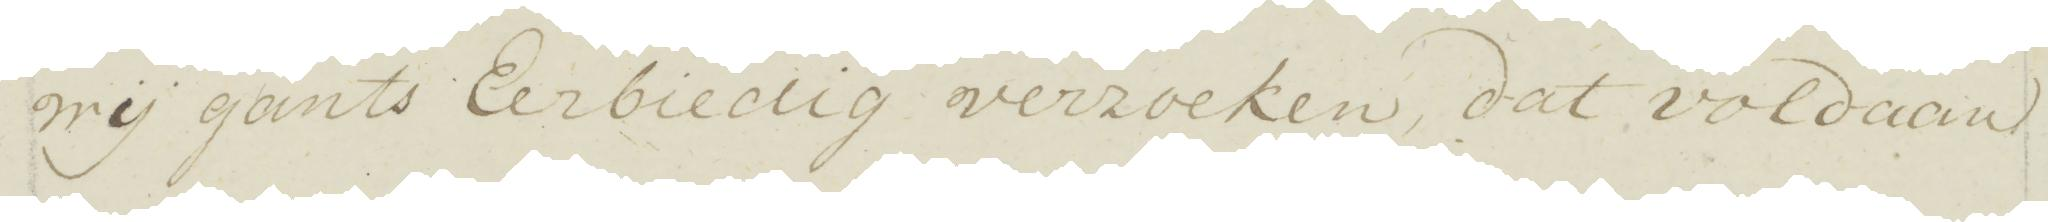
wij gants Eerbiedig verzoeken, dat voldaan
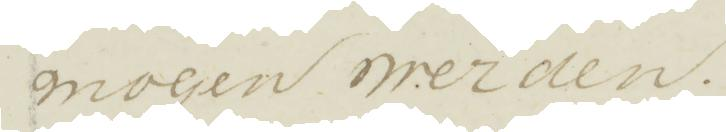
mogen werden.
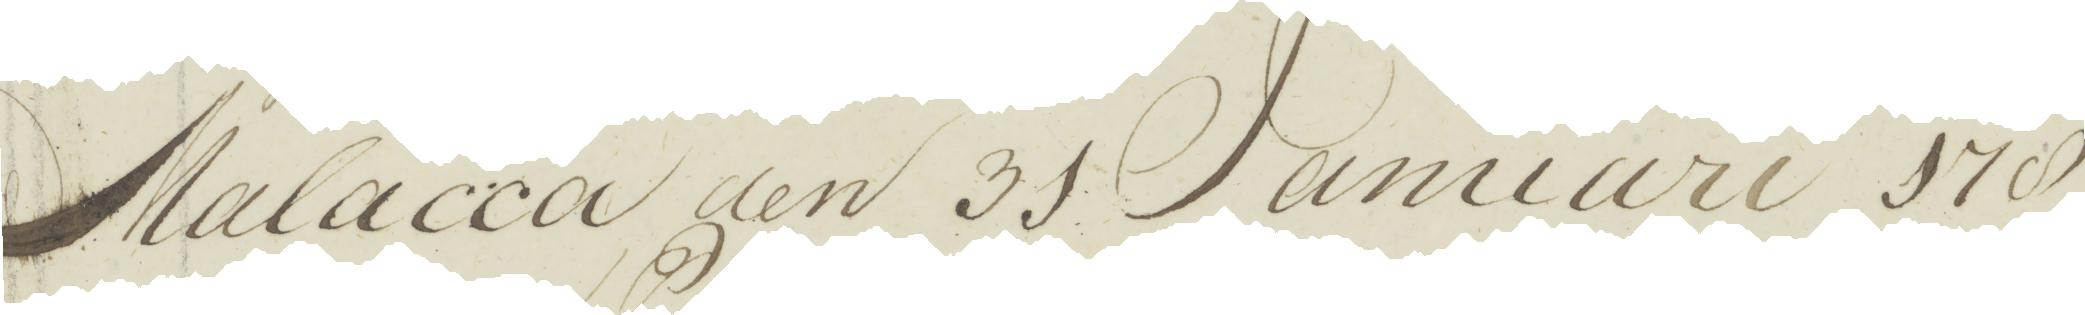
Malacca den 31 Januari 178
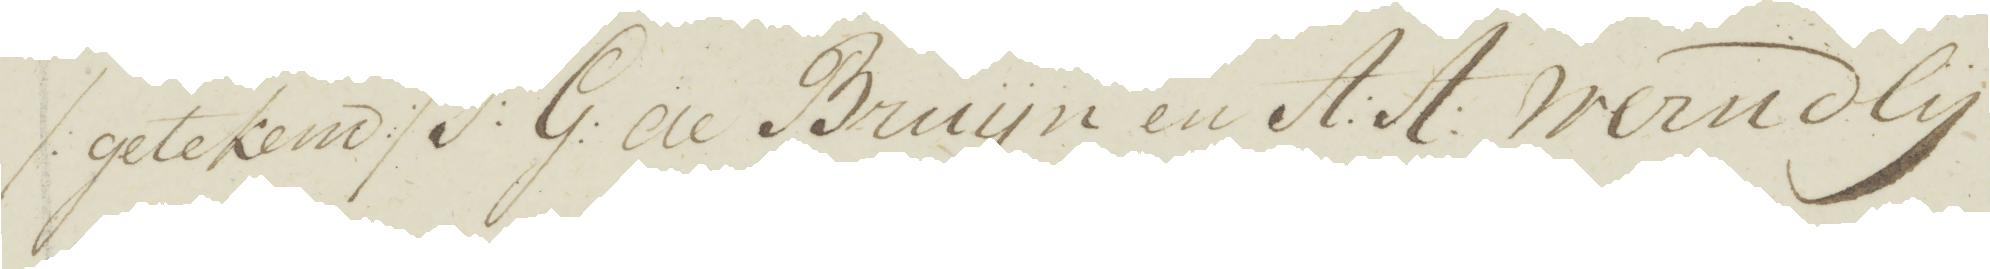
/:getekend:/ P: G: die Bruijn en A: A: werndlij
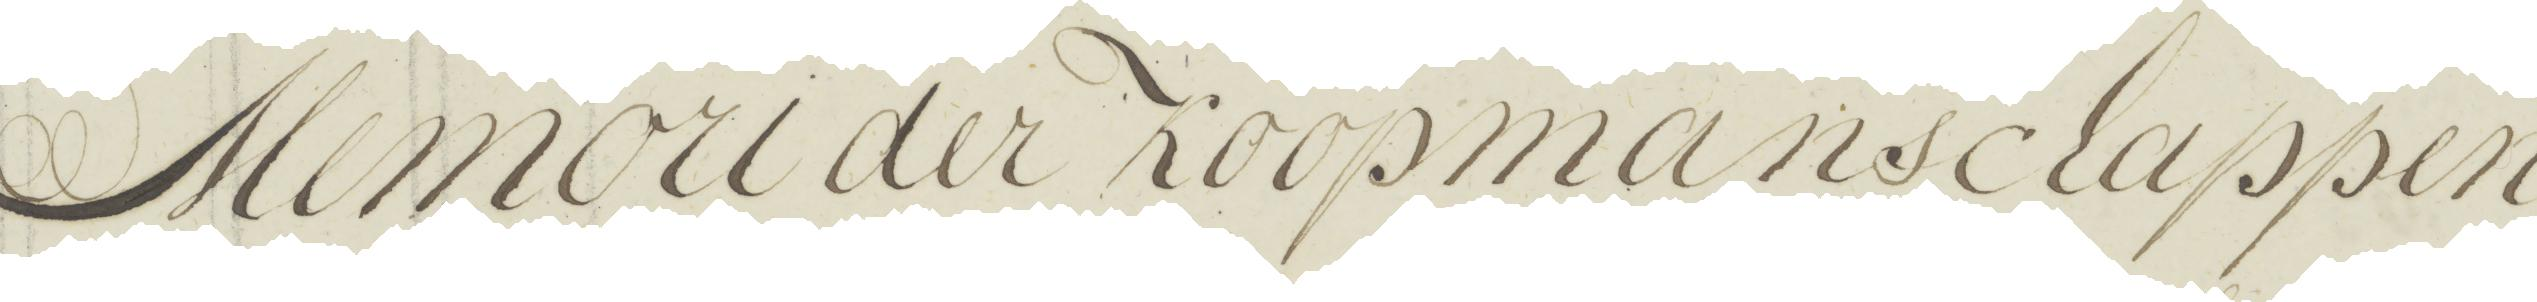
Memori der koopmanschappen
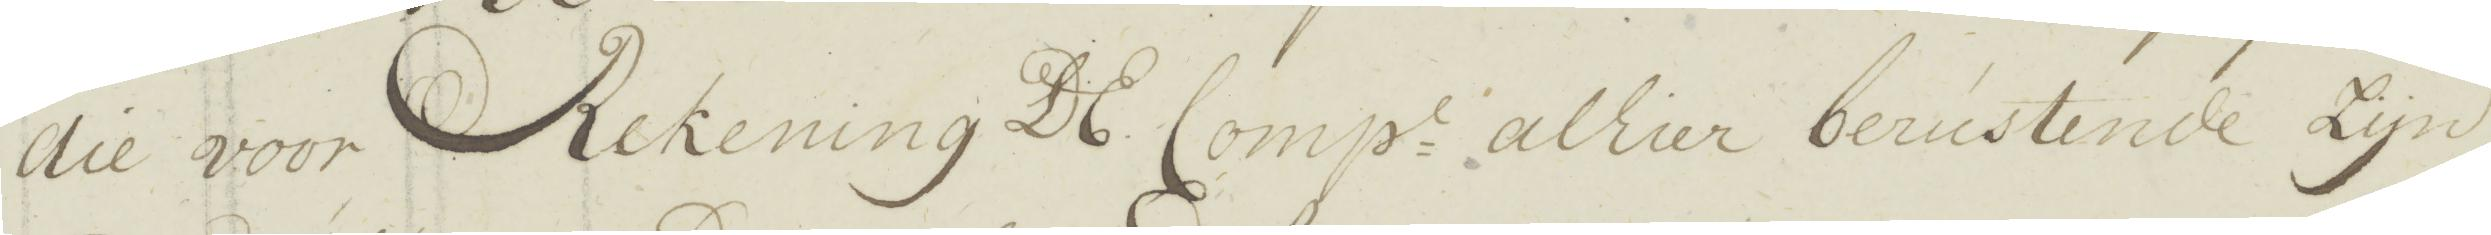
die voor Rekening DE Comp=e alhier berustende zijn
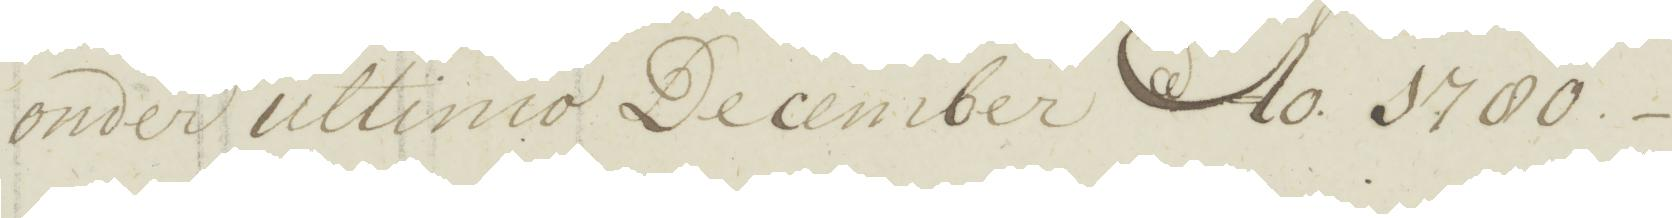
onder ultimo December Ao. 1780.-
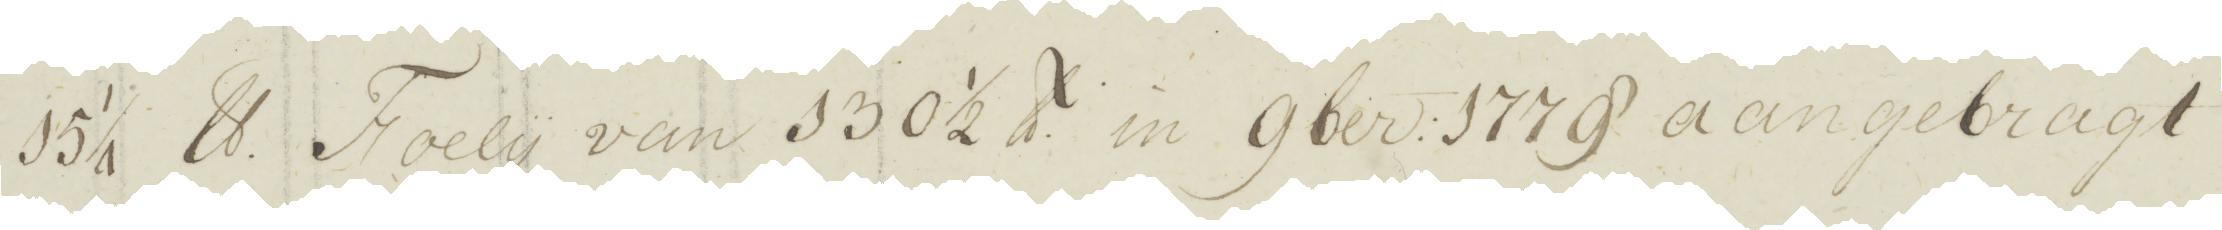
15¼ lb. Foelij van 130½ lb. in 9ber: 1779 aangebragt
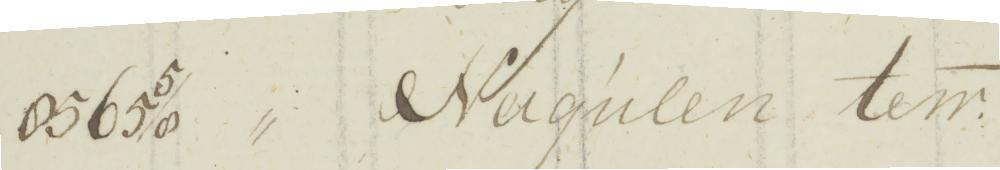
8565 5/8 „ Nagulen tew.
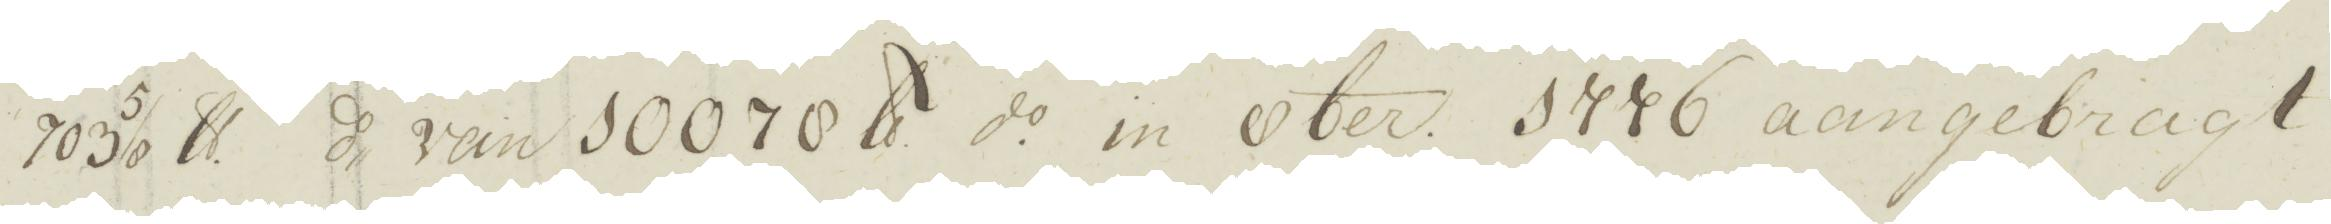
703 5/8 lb: d„o van 10078 lb d.o in 8ber. 1776 aangebragt
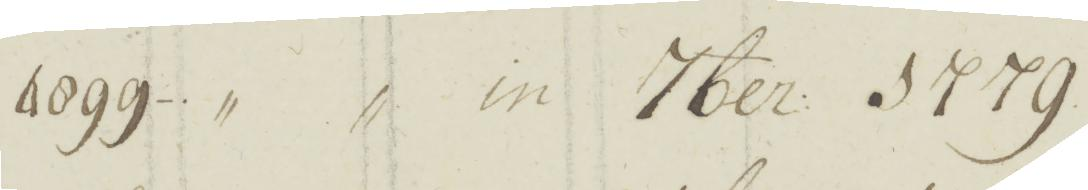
4899- „ „ in 7ber: 1779.
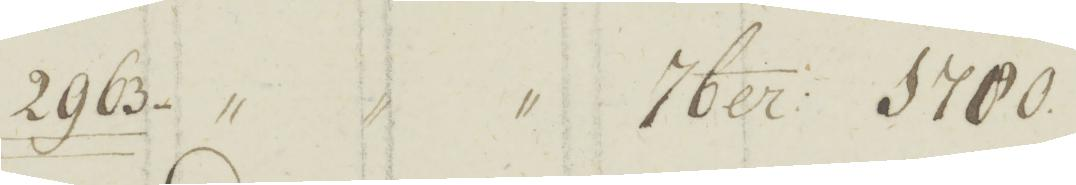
2963- „ „ „ 7ber: 1780.
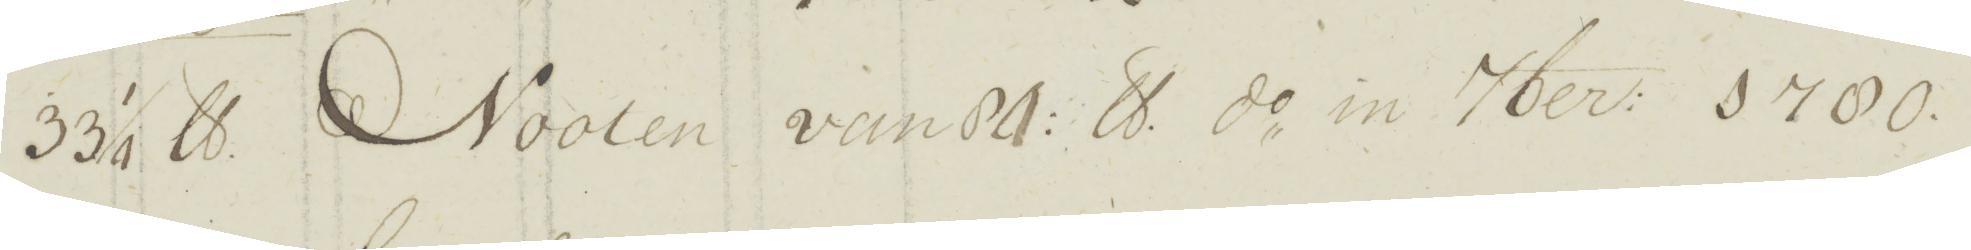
33¼ lb. Nooten van 84: lb. d„o in 7ber: 1780.
